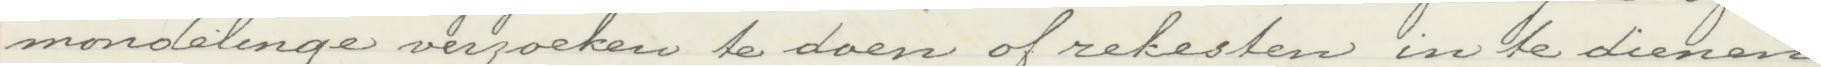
mondelinge verzoeken te doen of rekesten in te dienen
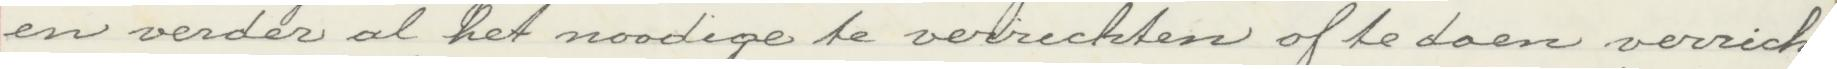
en verder al het noodige te verrichten of te doen verrich
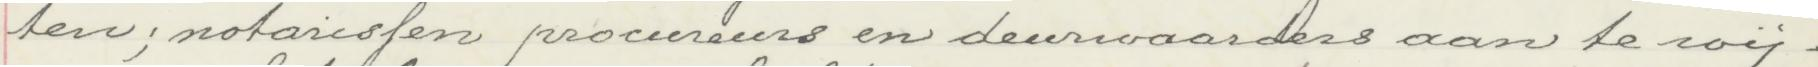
ten; notarissen procureurs en deurwaarders aan te wij
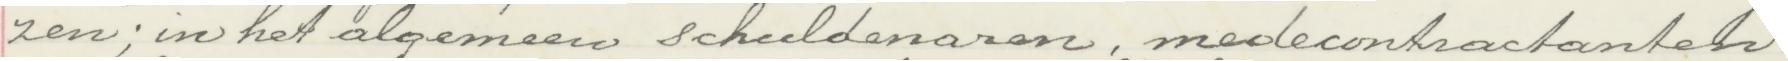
zen; in het algemeen schuldenaren, medecontractanten
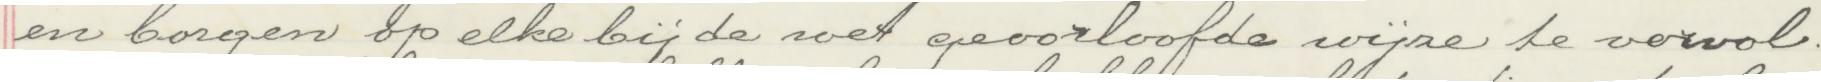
en borgen op elke bij de wet geoorloofde wijze te vervol
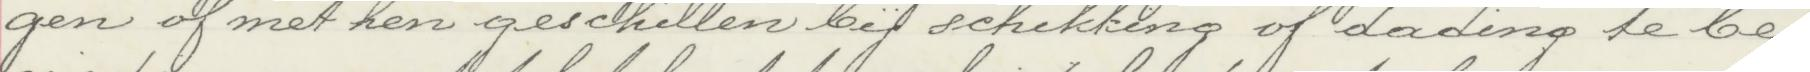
gen of met hen geschillen bij schikking of dading te be
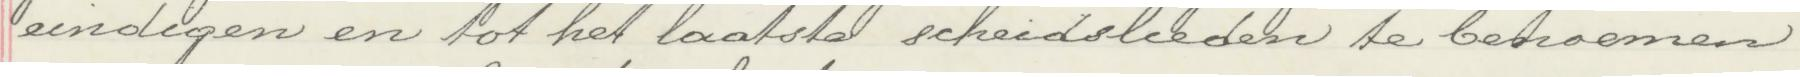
eindigen en tot het laatste scheidslieden te benoemen
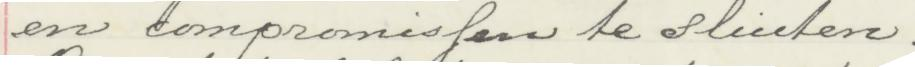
en compromissen te sluiten
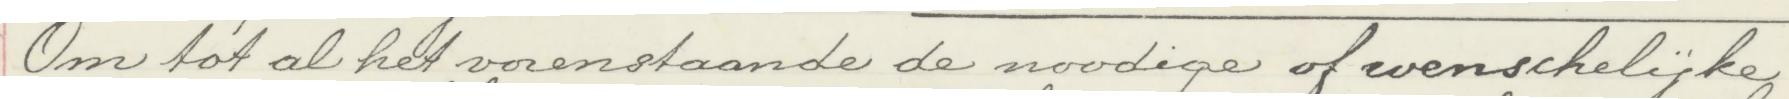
Om tot al het vorenstaande de noodige of wenschelijke
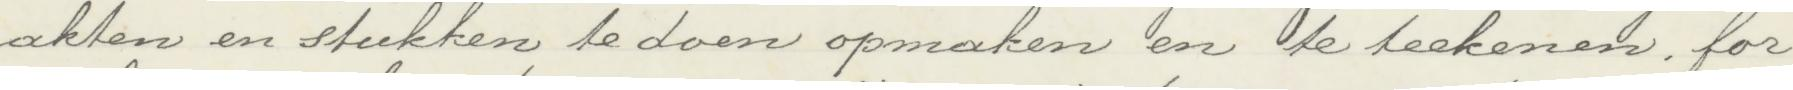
akten en stukken te doen opmaken en te teekenen, for
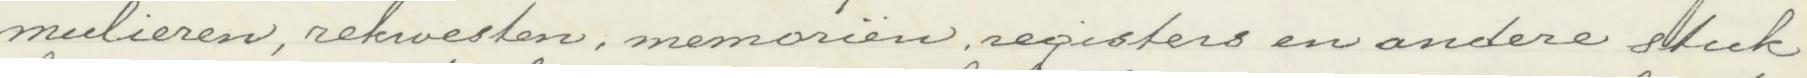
mulieren, rekwesten, memoriën, registers en andere stuk
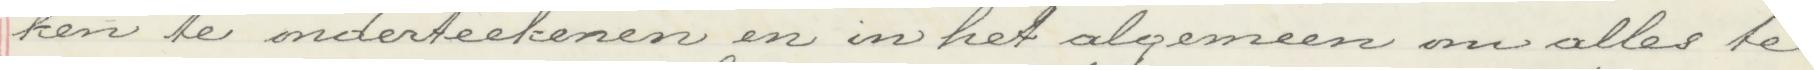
ken te onderteekenen en in het algemeen om alles te
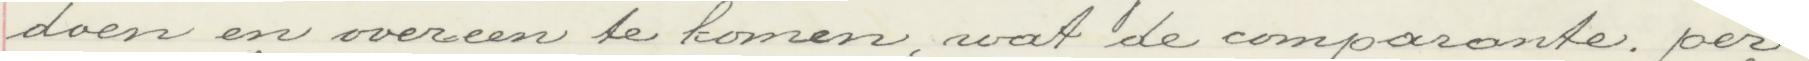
doen en overeen te komen, wat de comparante. per
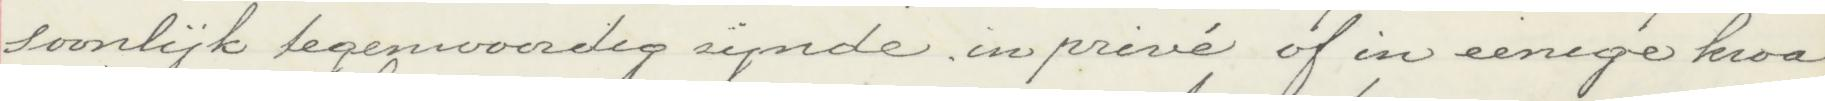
soonlijk tegenwoordig zijnde in privé of in eenige kwa
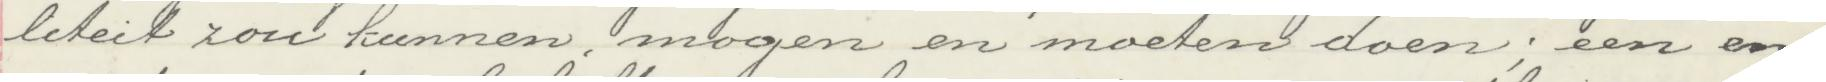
liteit zou kunnen, mogen en moeten doen; een en
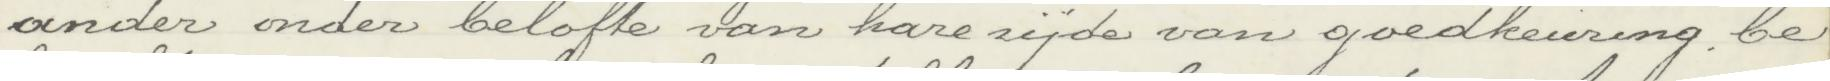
ander onder belofte van hare zijde van goedkeuring, be
